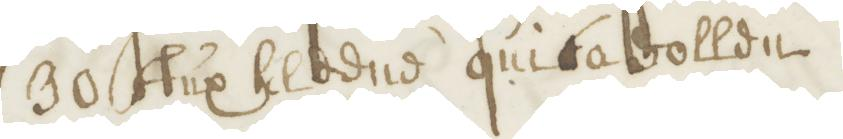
30 stux kleene quitadollen
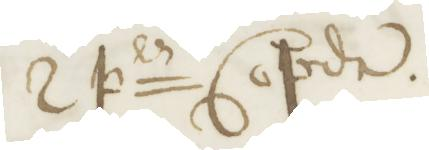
2 p=ls Coper
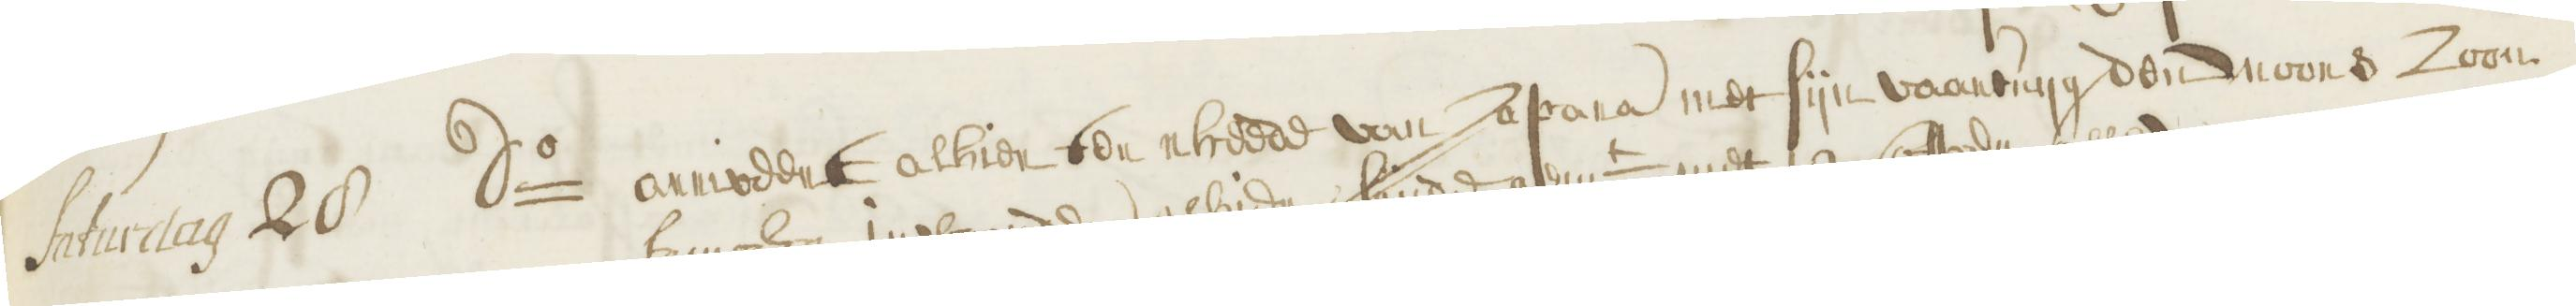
Saturdag 28 d=o arriveert alhier ter rheede van Japara met sijn vaartuyg den moors zoon
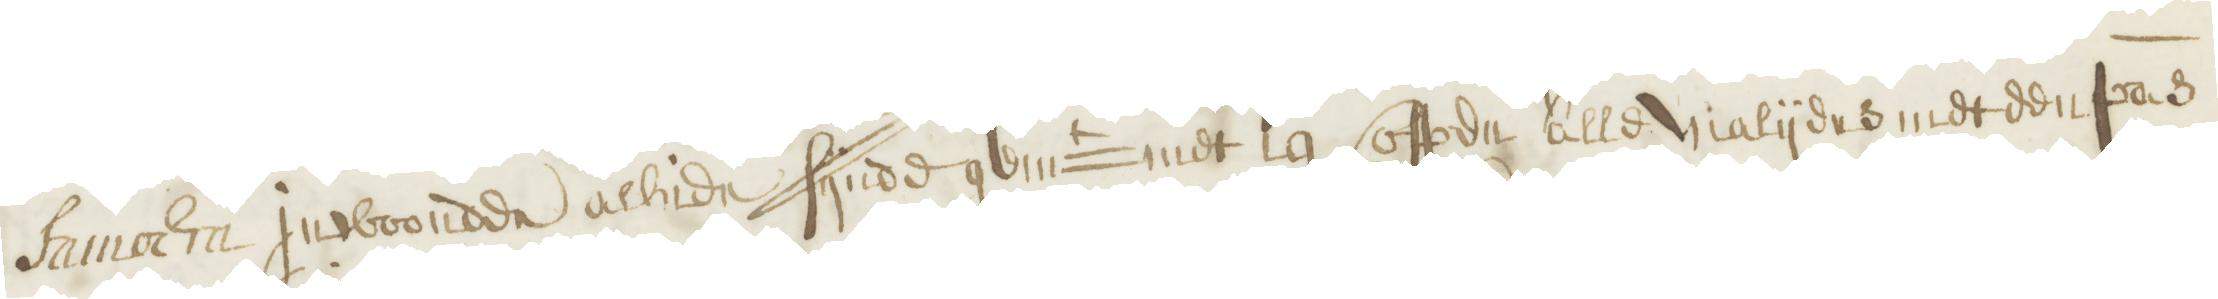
Samoen jnwoonder alhier sijnde gem=t met 19 Coppen alle malijers met een pas
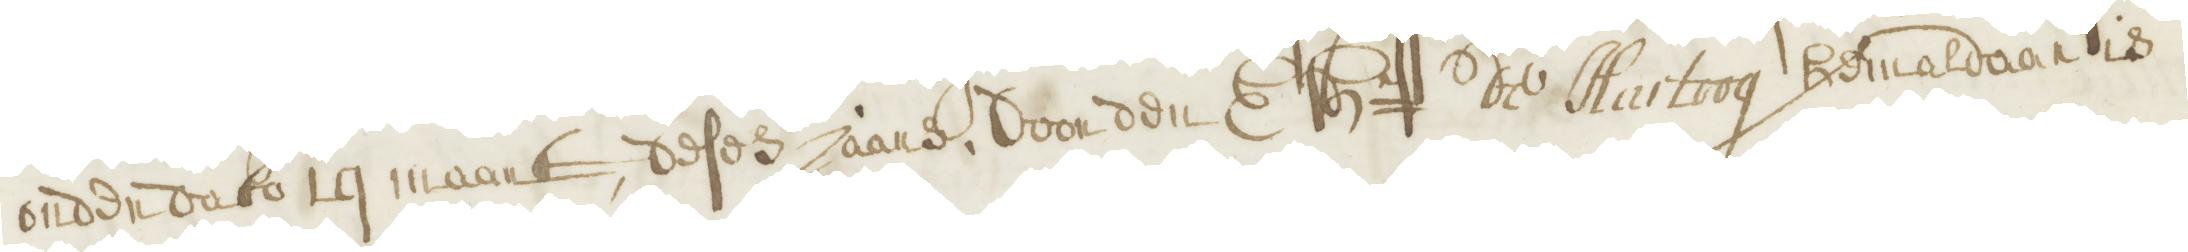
onder dato 19 maart, deses jaare, door den E H=r de Hartoog hem aldaar is
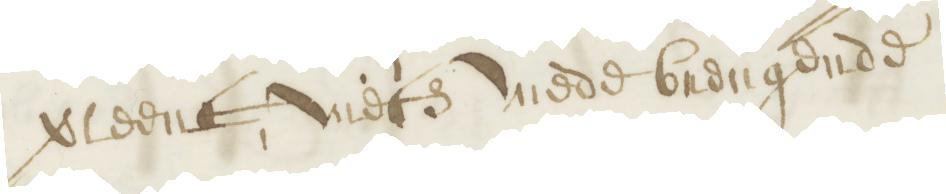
verleent, niets mede brengende
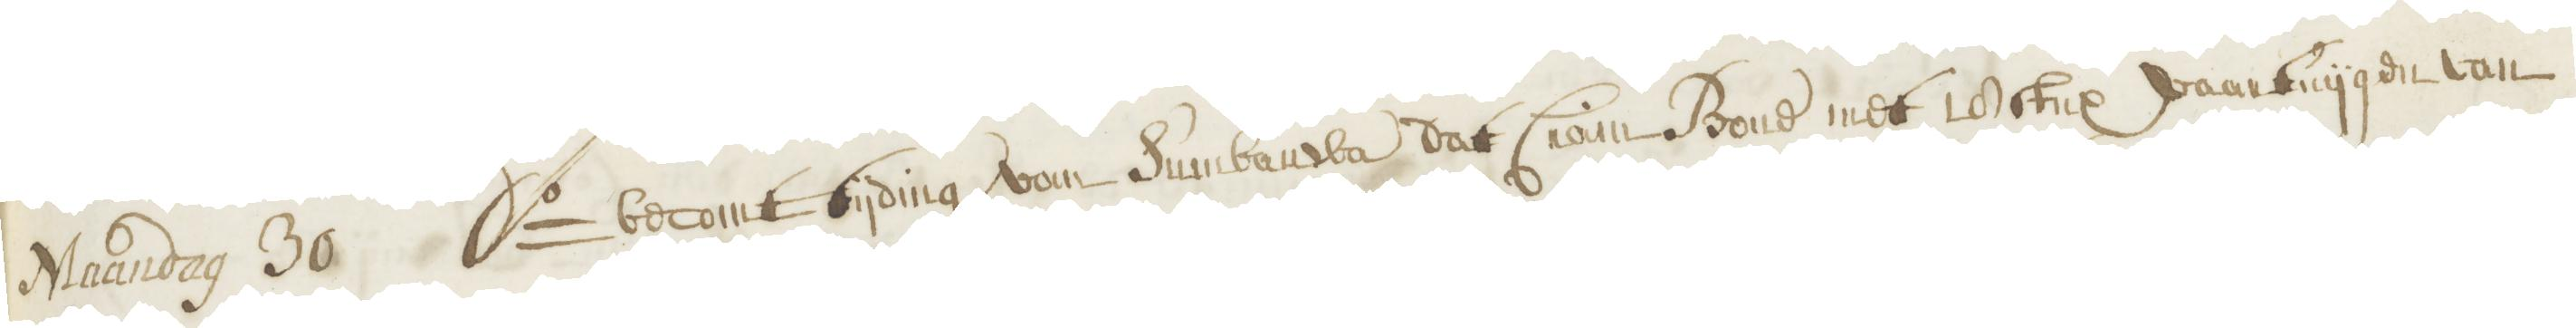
Maandag 30 d=o becomt tijding van Sumbanwa dat Crain Bone met 18 stux vaartuijgen van
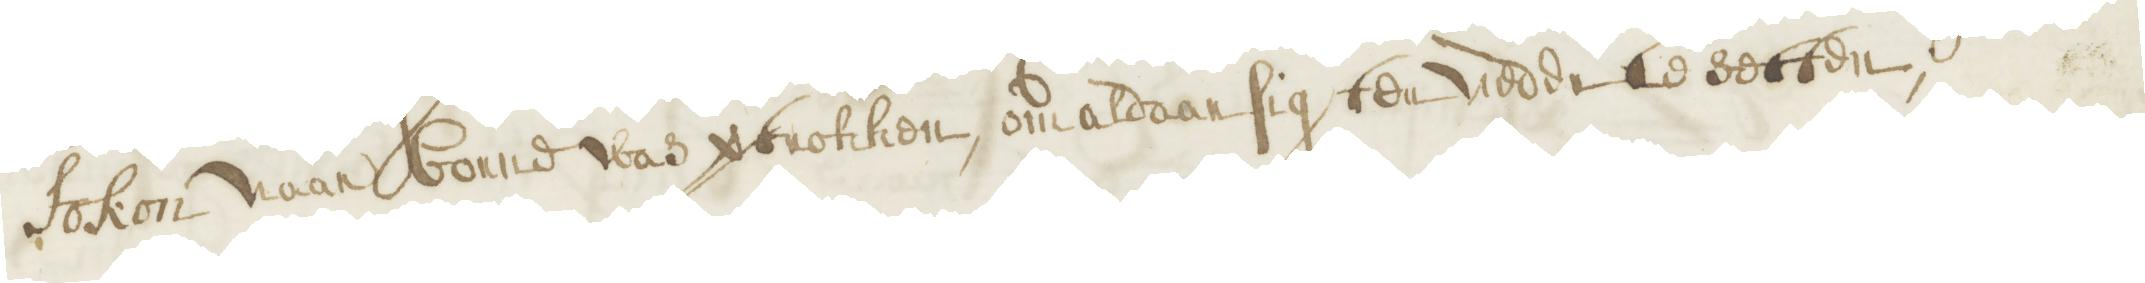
sokon naar borne was vertrokken, om aldaar sig ten neder te setten,
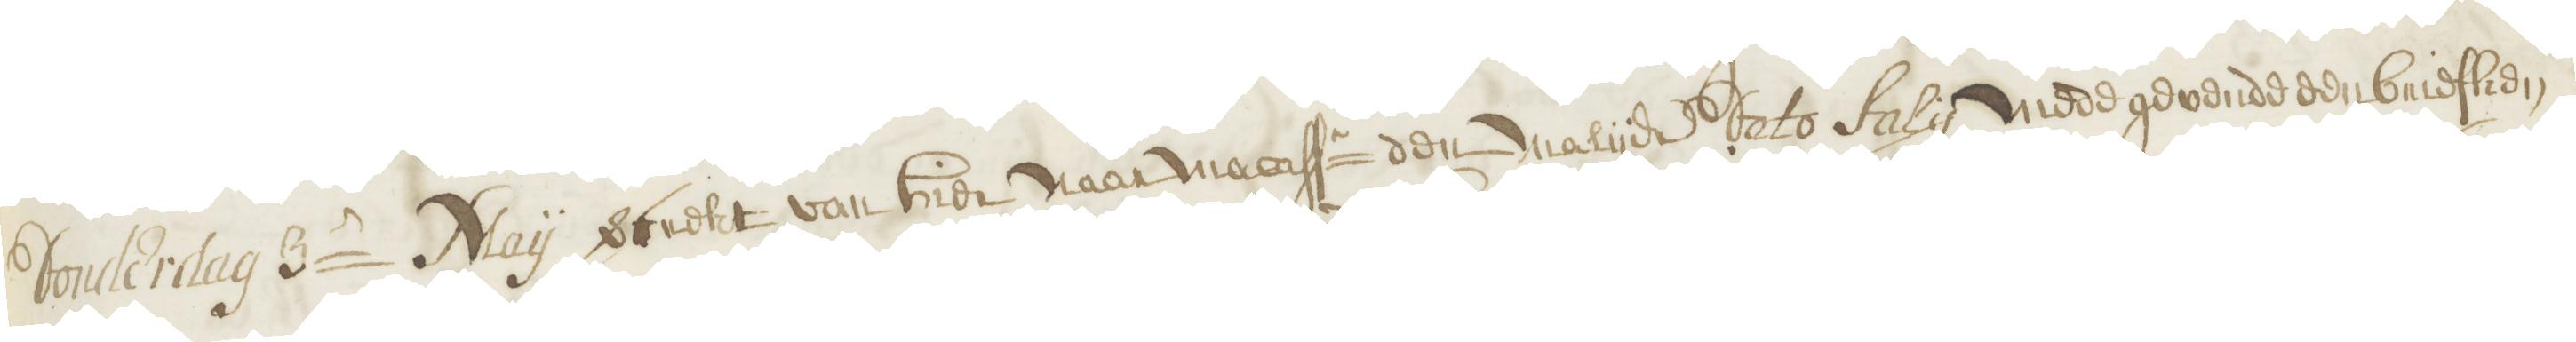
donderdag 3=en Maij vertrekt van hier naar macass=r den malijer doto salij mede gevonde een briefken
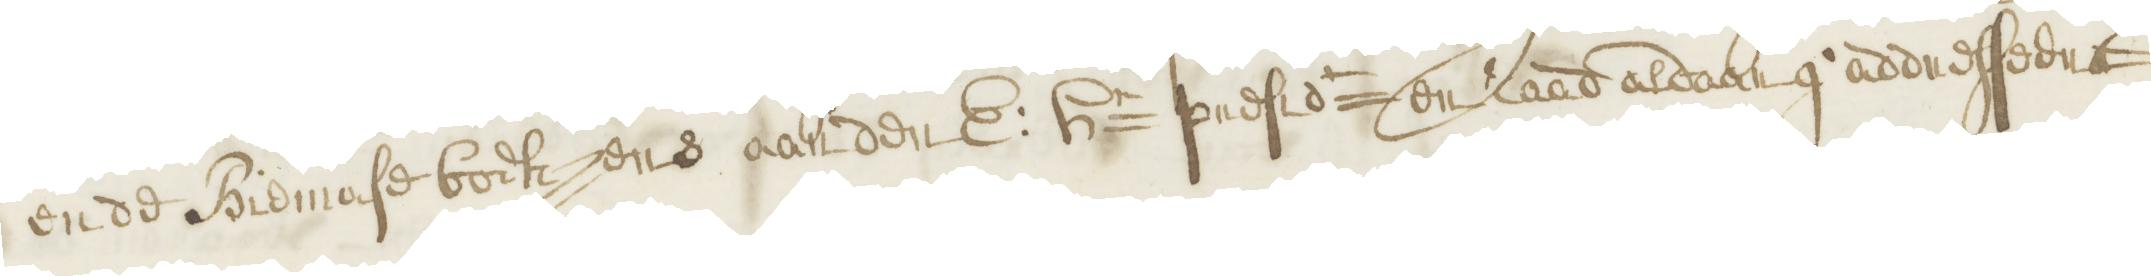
ende Biemase boekjens aan den E: h=r presid=t en raad aldaar g’addresseert
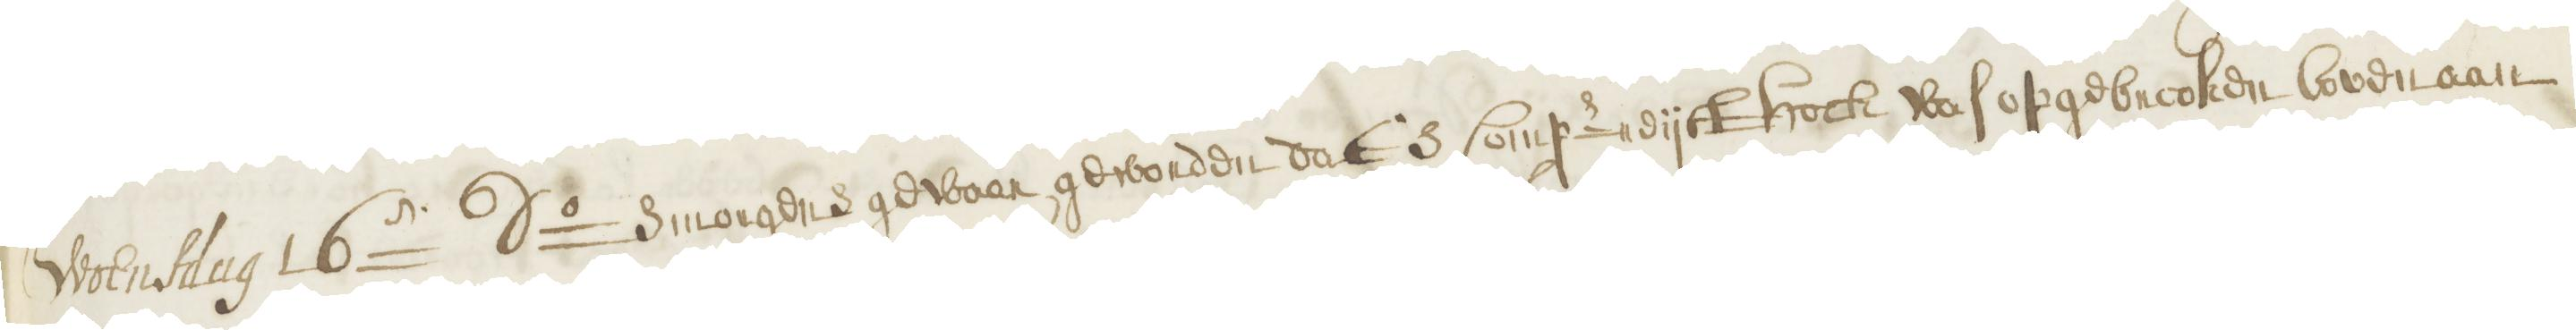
Woensdag 16=en d=o smorgens gewaar geworden dat ’s Comp=s reijst hock was opgebrooken boven aan
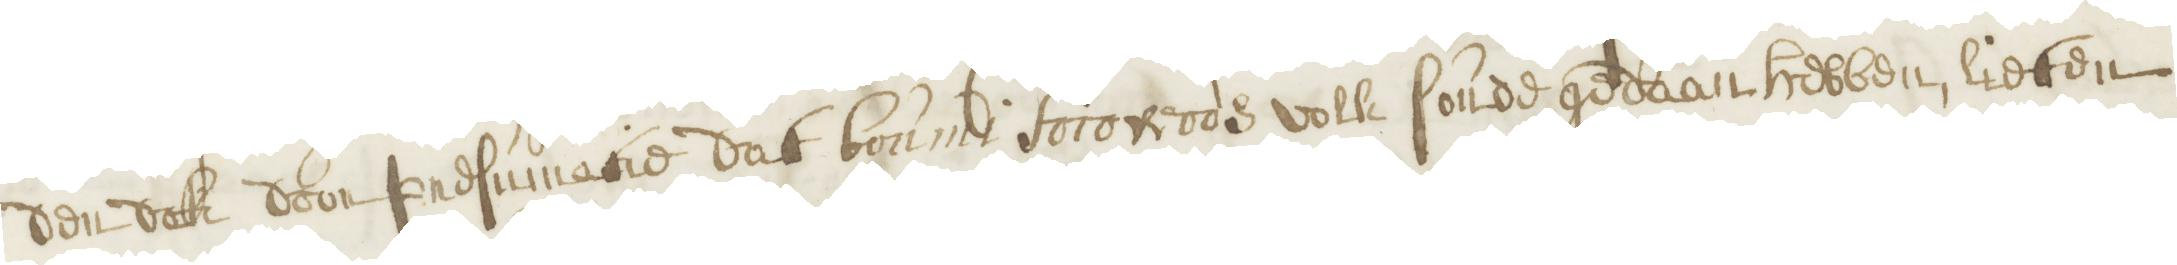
den dok door presuimatie dat boumi sorowoos volk soude gedaan hebben, lieten
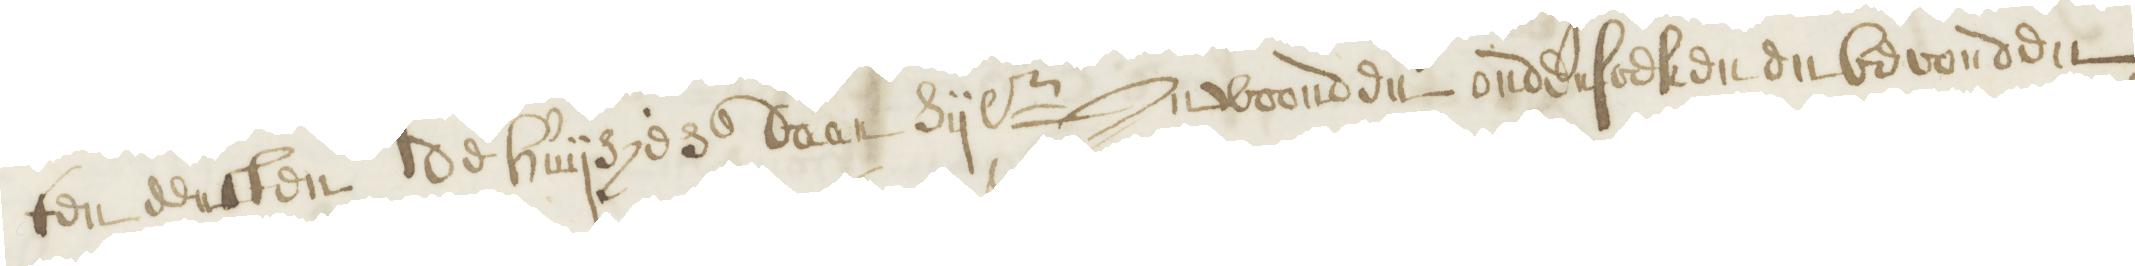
ten eersten de huijsjes daar sijl=n jnwoonder ondersoeken en bevonden
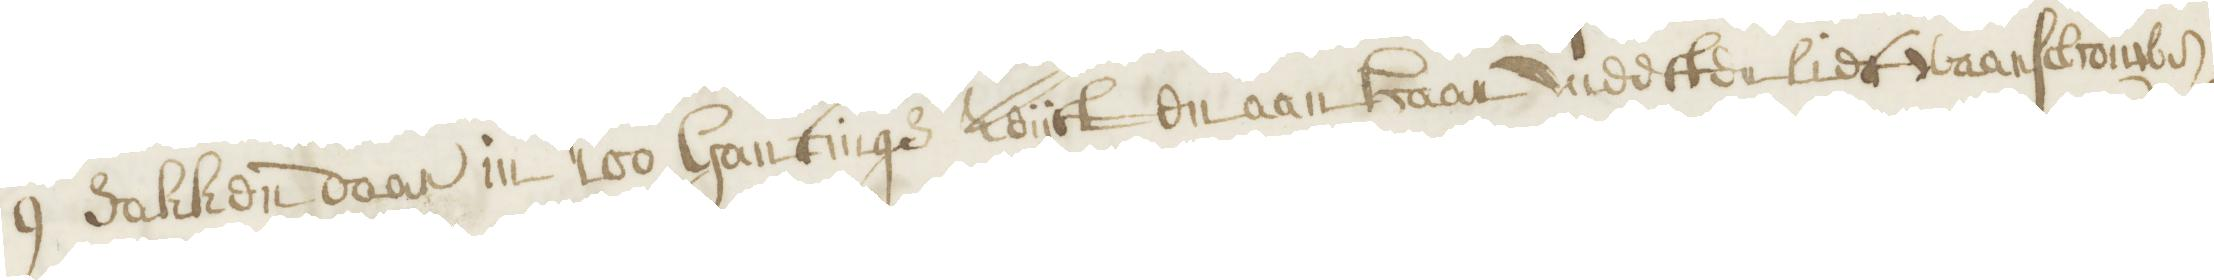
9 sakken daar in 100 Gantings reijst en aan haar meester liet waarschouwen
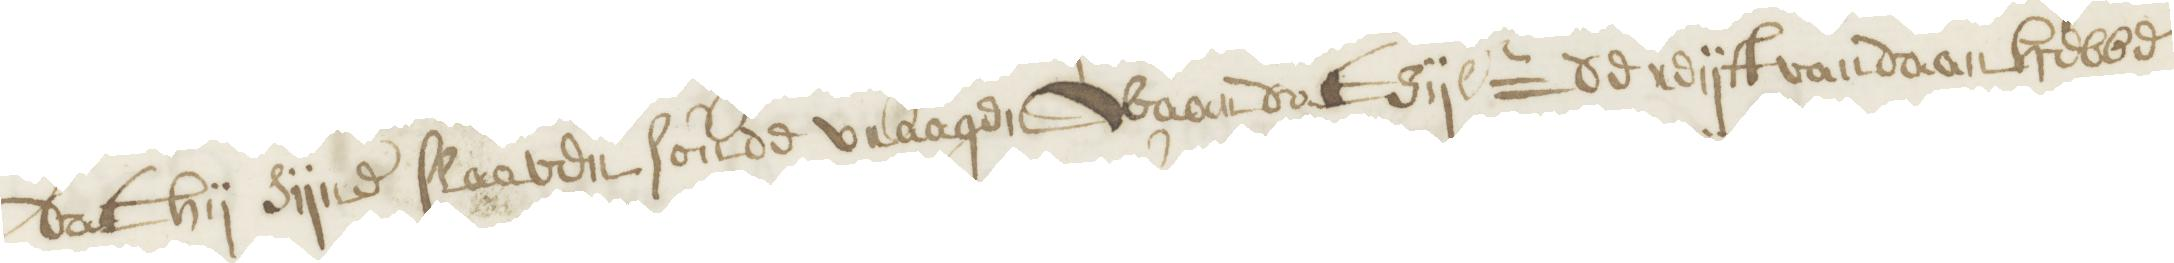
dat hij sijne slaaven soude vraagen waardat sijl=n de reijst van daan hebbe
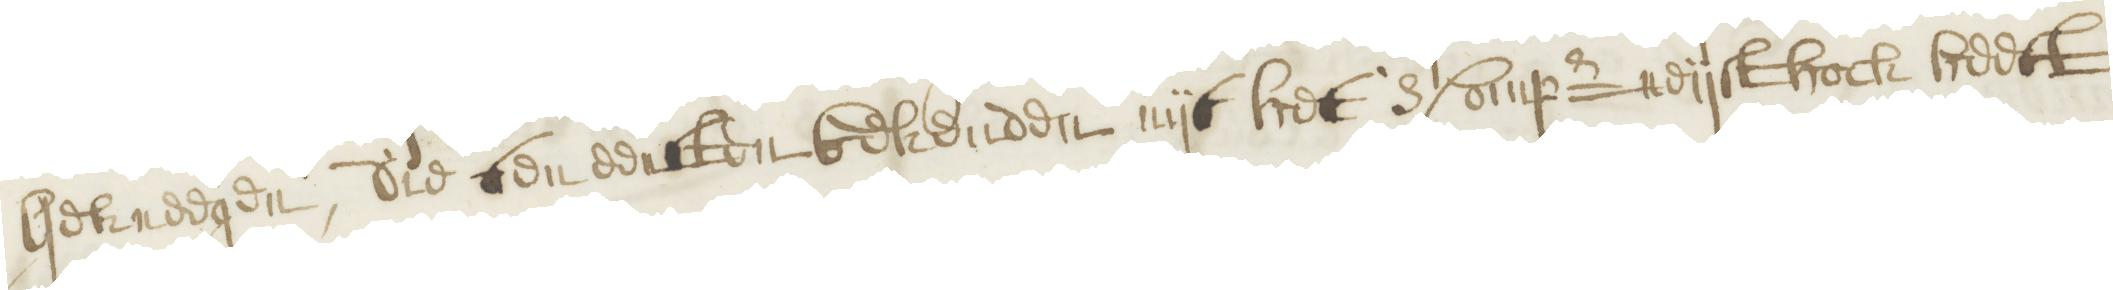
gekreegen, die ten eersten bekenden uijt het ’s Comp=s reijsthock heeft
